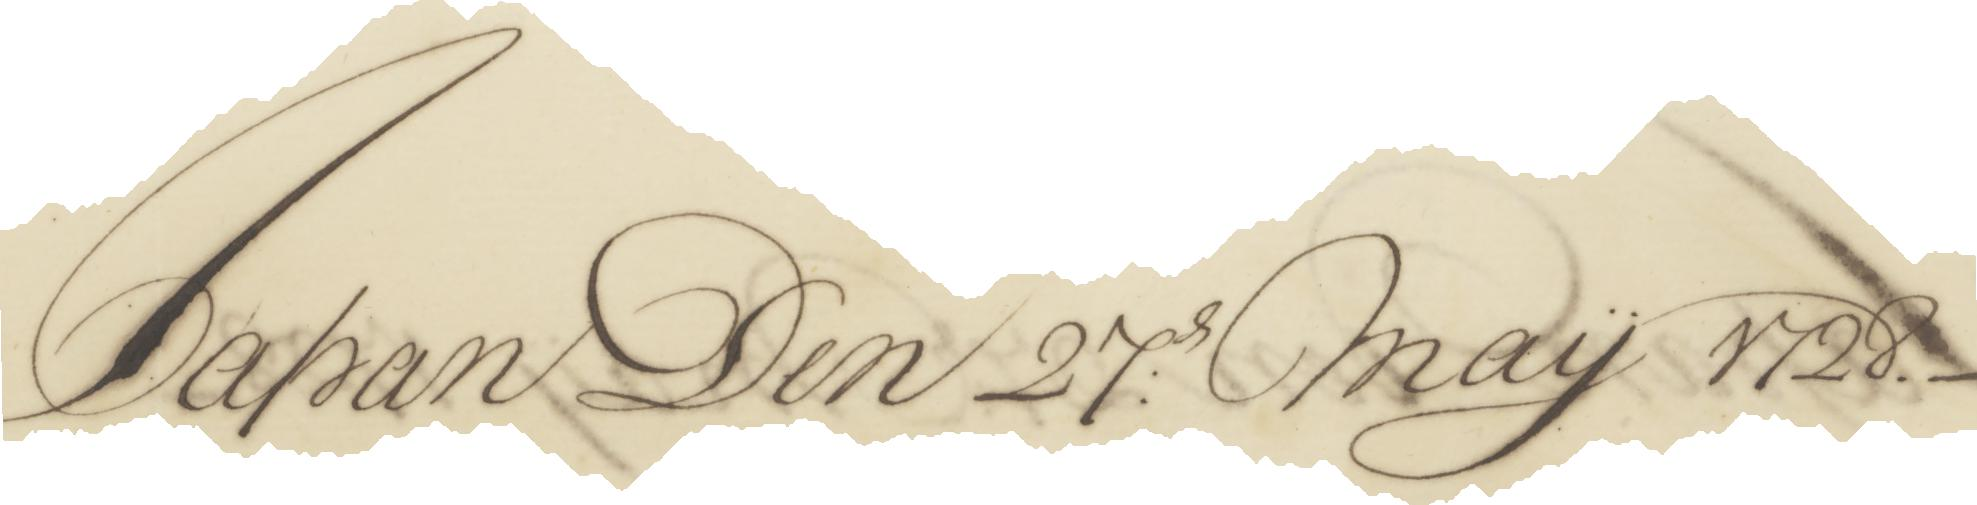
Japan Den 27:en Maij 1728._
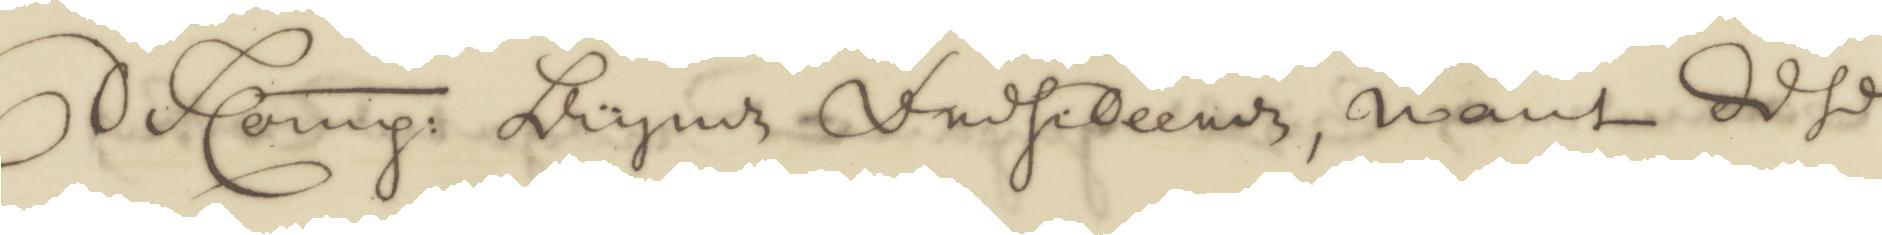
dEComp: schijnen te resideeren, want dese
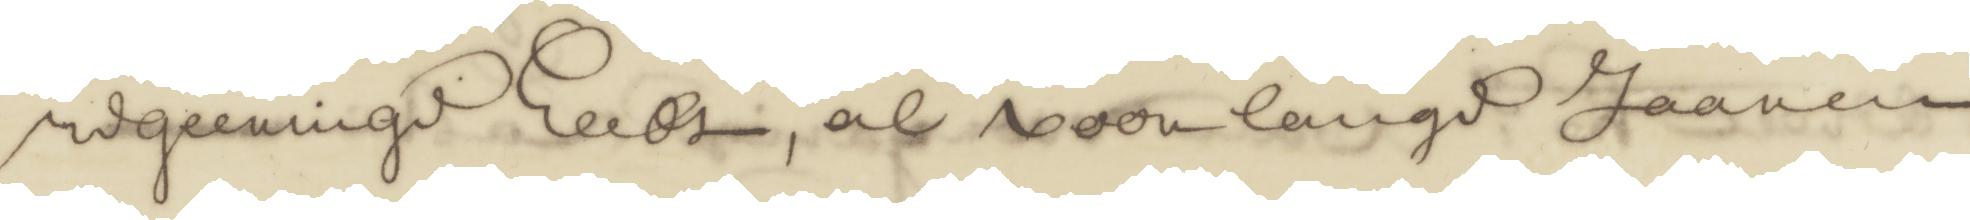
regeeringe heeft, al voor lange Jaaren
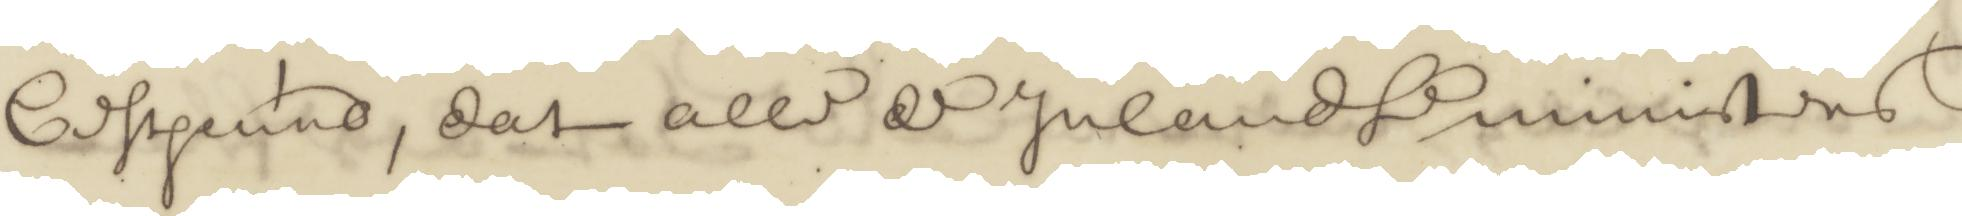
bespeurd, dat alle de Jnlandse ministers
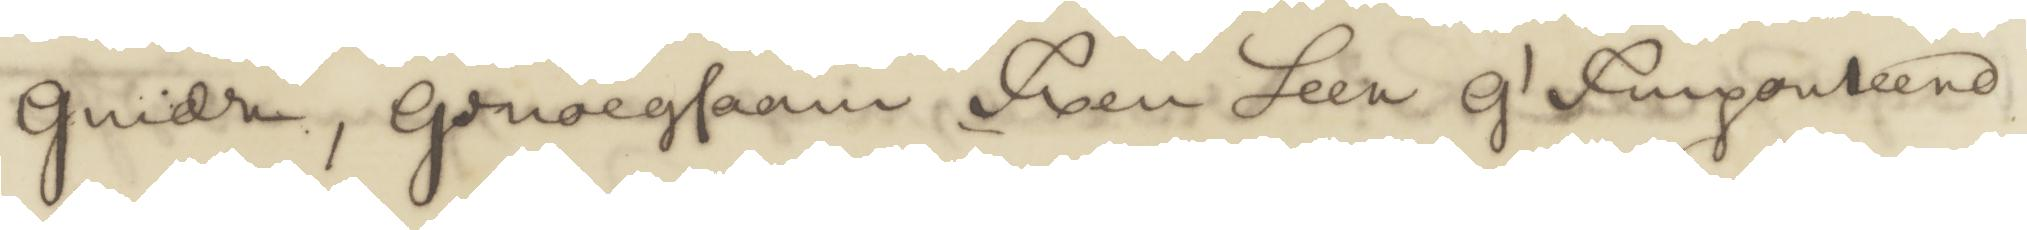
ginder, genoegsaam Even seer g’Emporteerd
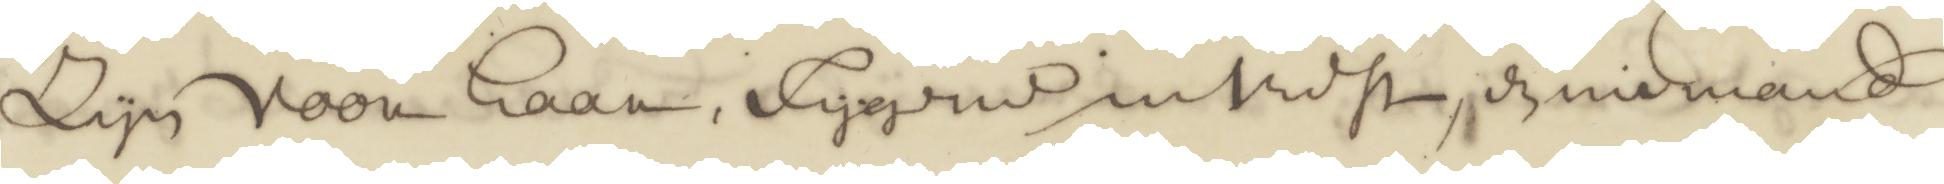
Zijn voor haar, eijgene intrest, en niemand
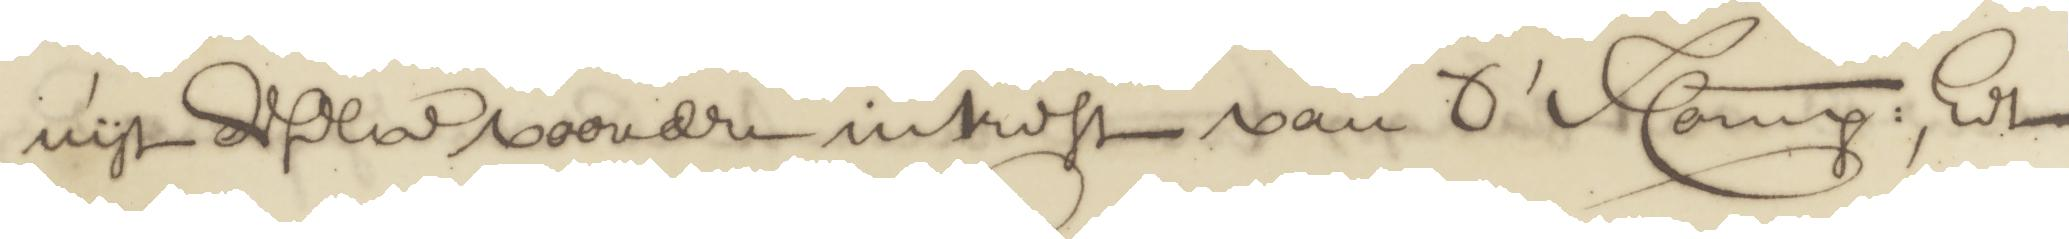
uijt deselve voor den intrest van d'EComp:, het
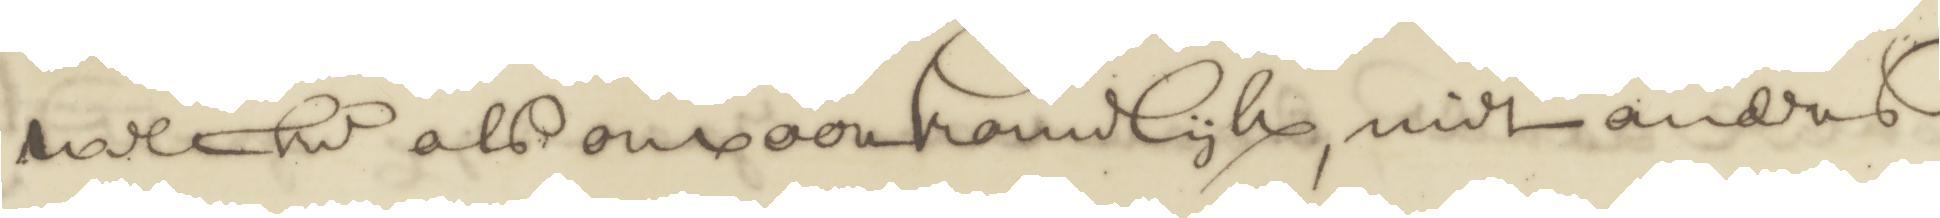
welcke als onvoorkomelijk, niet anders
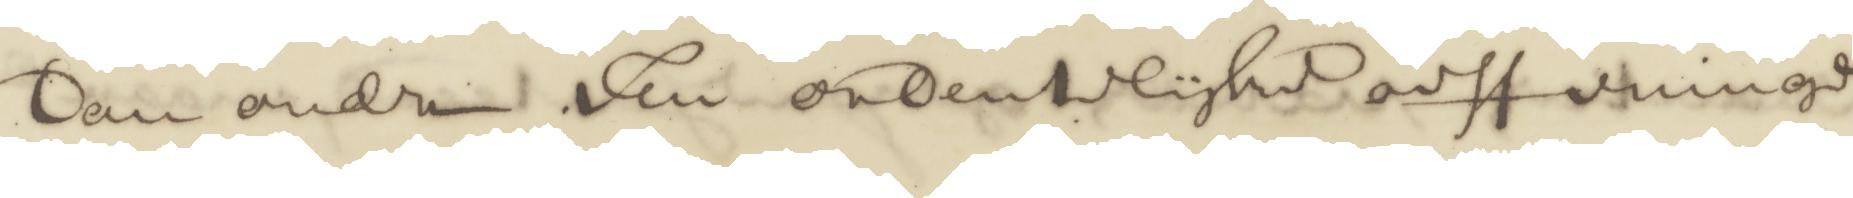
dan onder Een ordentelijke oeffeninge
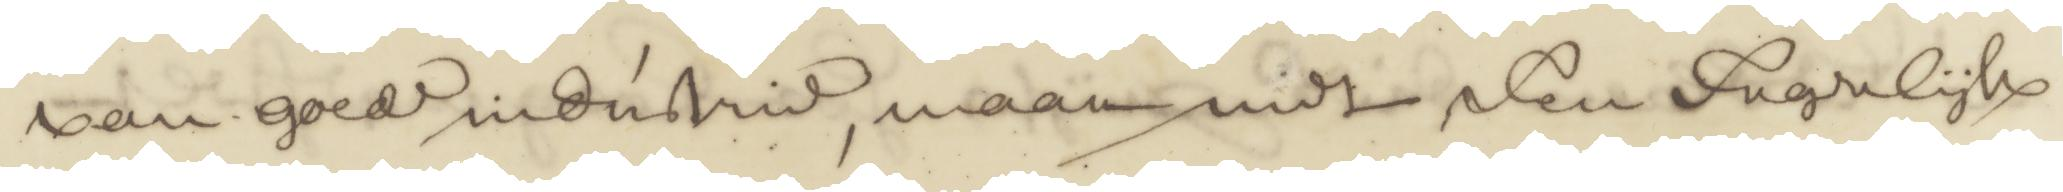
van goede industrie, maar met Een Ergerlijk
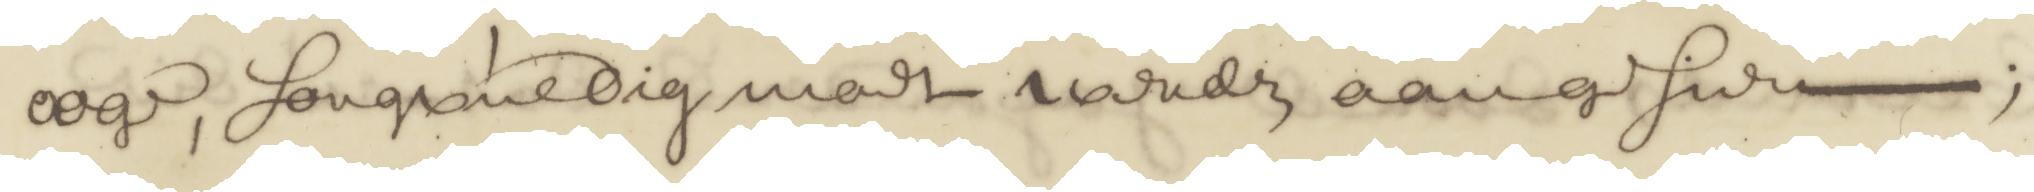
ooge, sorgvuldig moet werden aangesien;
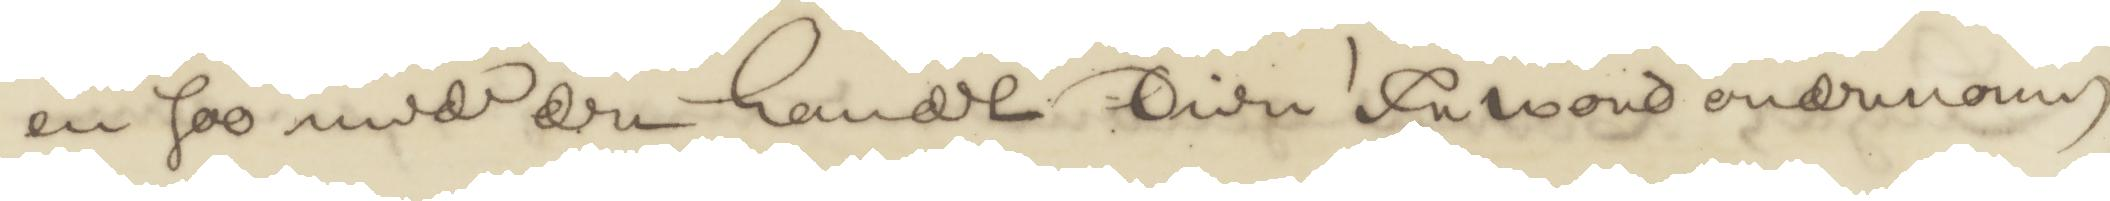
en soo mede den handel dien 'er word ondernomen
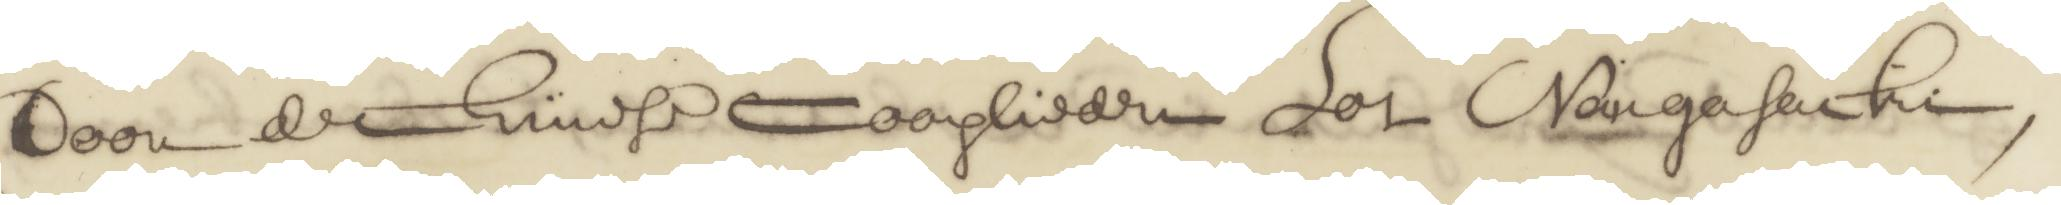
door de chinese cooplieden tot Nagasacki,
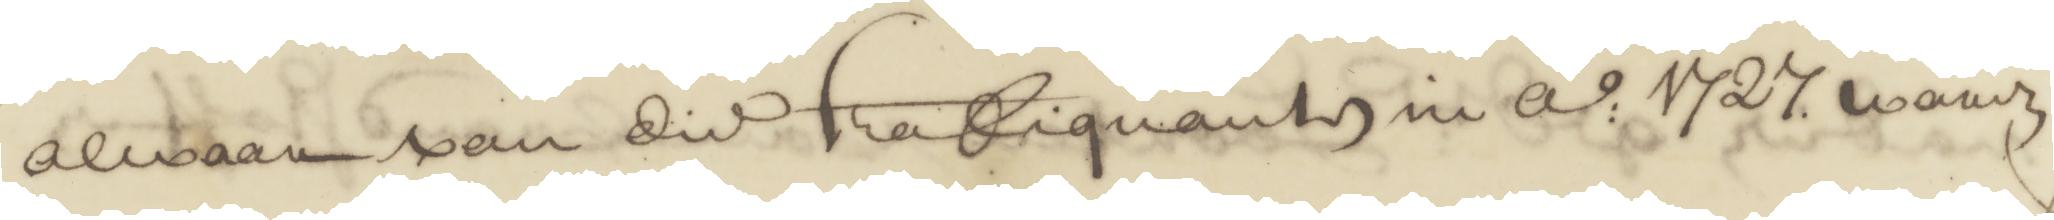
alwaar van die trafiquanten in a:o 1727. waren
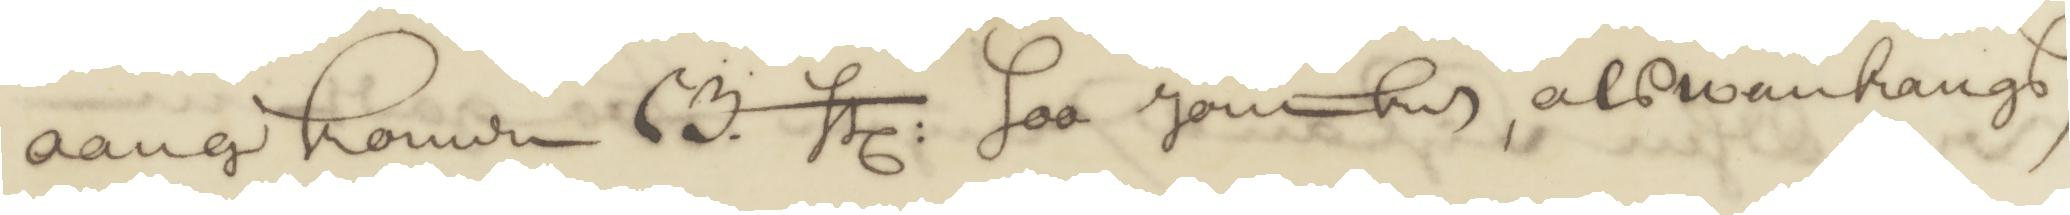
aangekomen 53. stx: soo joncken, als wankangs
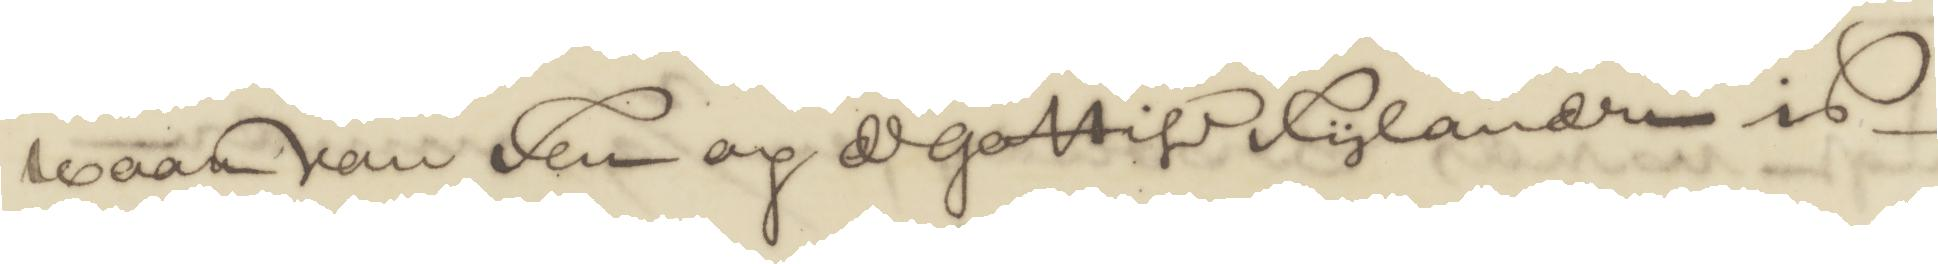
waar van Een op de gottise Eijlanden is
